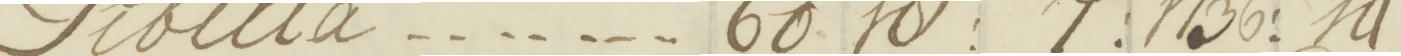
Sibilla - - - - - - - 60: 18 : 7 : 1736: 14
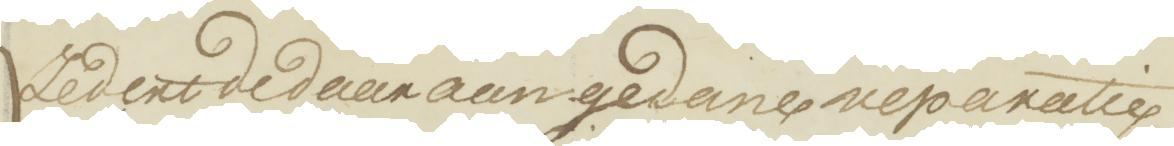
zedert de daar aan gedane reparatie
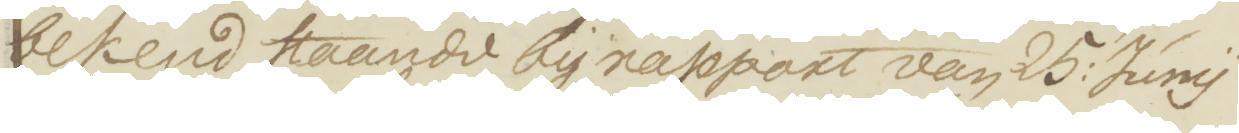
bekend staande bij rapport van 25: Junij
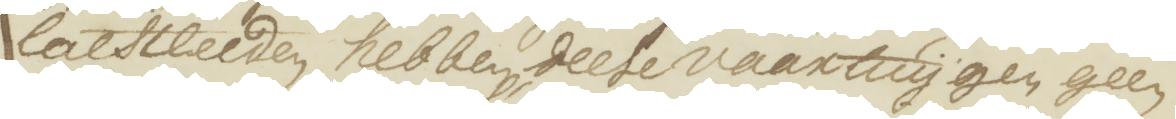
laestleeden hebben deese vaartuijgen geen
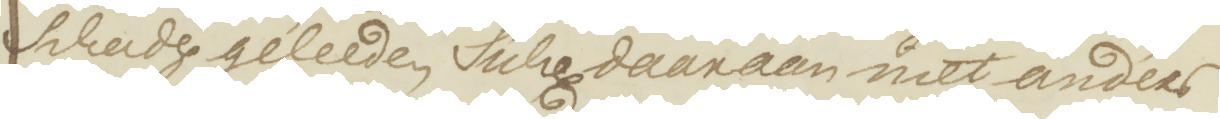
schade geleeden sulx daaraan niet anders
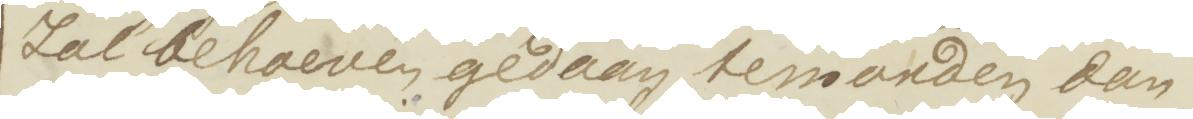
zal behoeven gedaan teworden dan
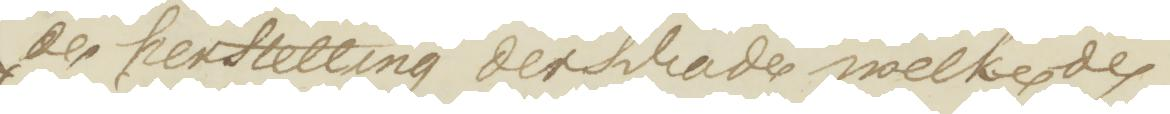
de herstelling derschade welke de
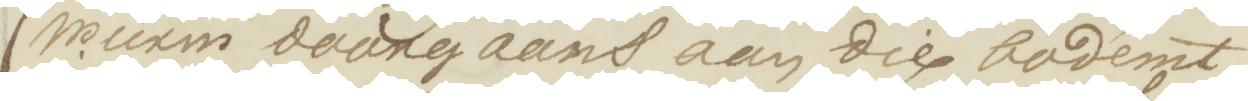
wurm doorgaans aan die bodemt
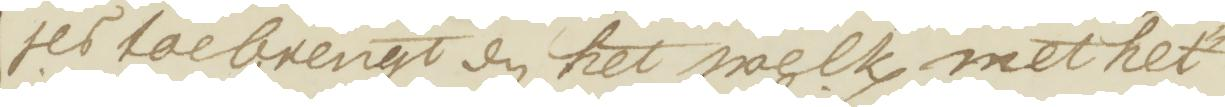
jes toebrengt en het welk met het
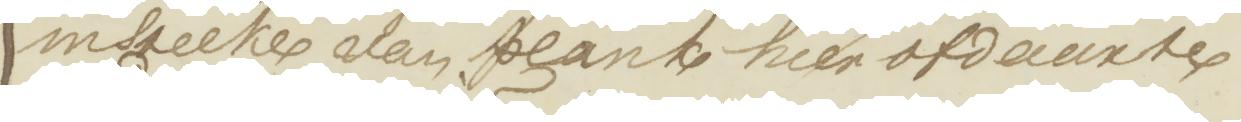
insteeke van plank hier ofdaarte
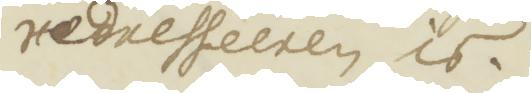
redresseeren is.
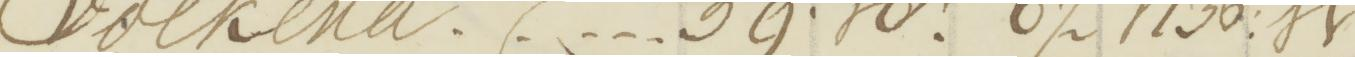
Volkera - - - - - 59. 18: 6½ 1736: 11
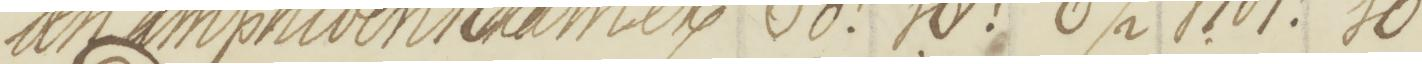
den amphioenKaamer 60: 18: 6½ 1707: 10
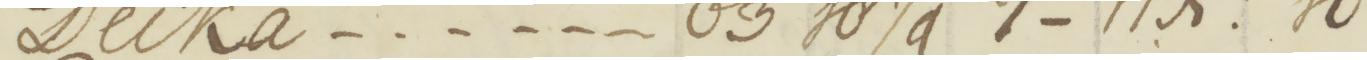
Deika - - - - - - 63 18¼ 7- 1735: 10
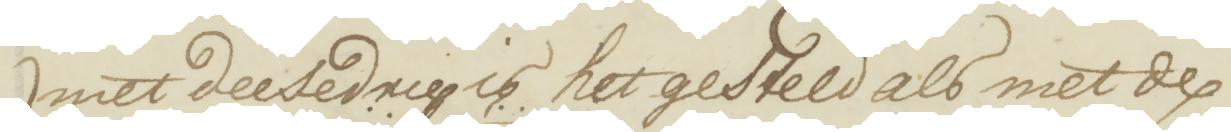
met deesedrie is, het gesteld als met de
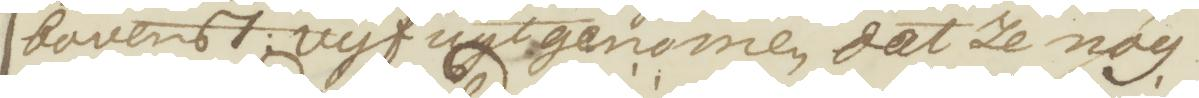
bovenst: vijf uijtgenomen dat ze nog
